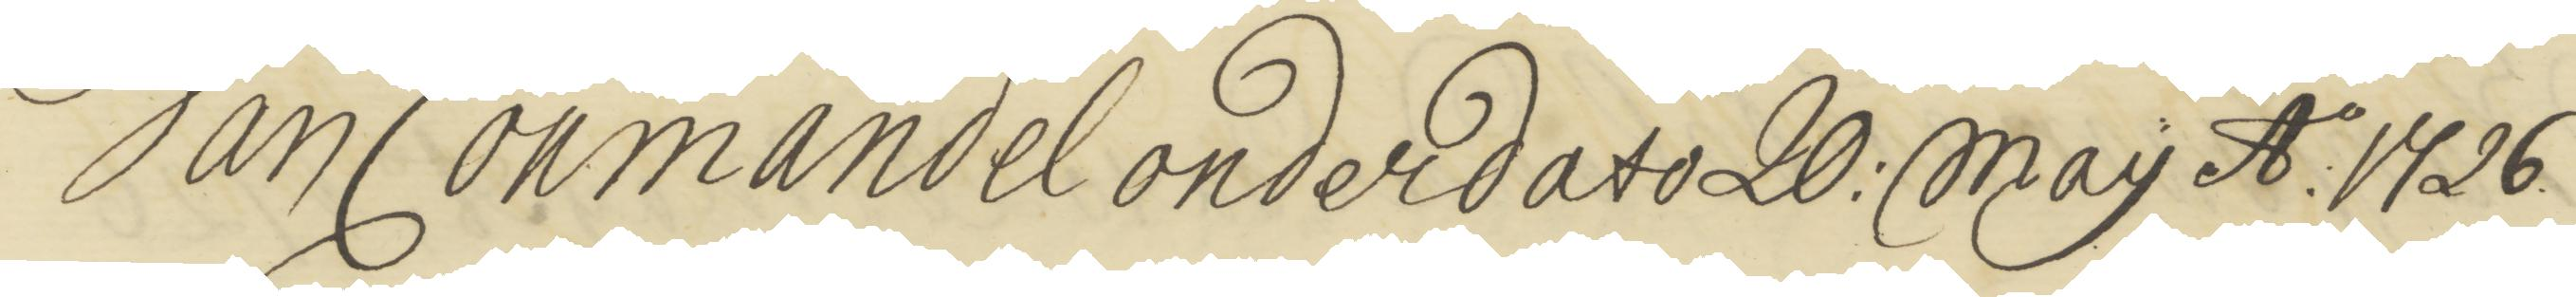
Van Cormandel onder dato 20: Maij A:o 1726.
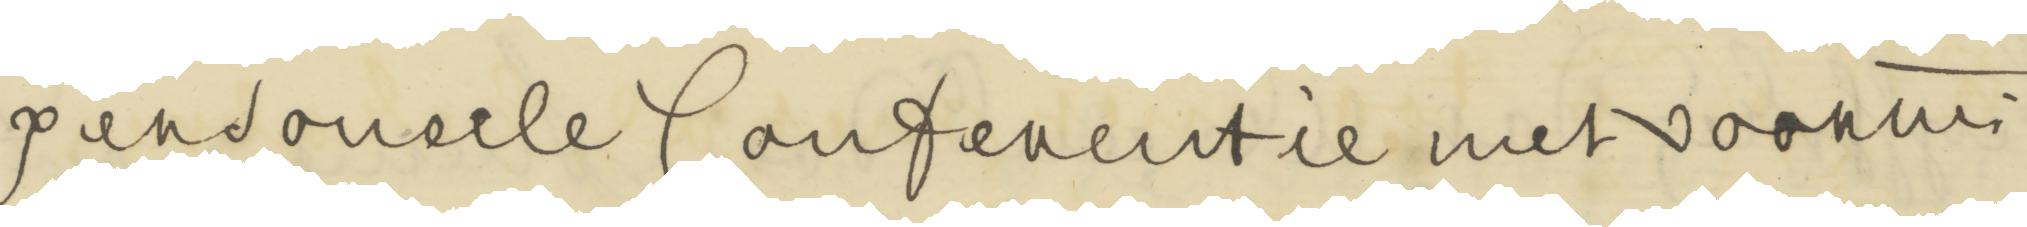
personeele Conferentie met voorm:
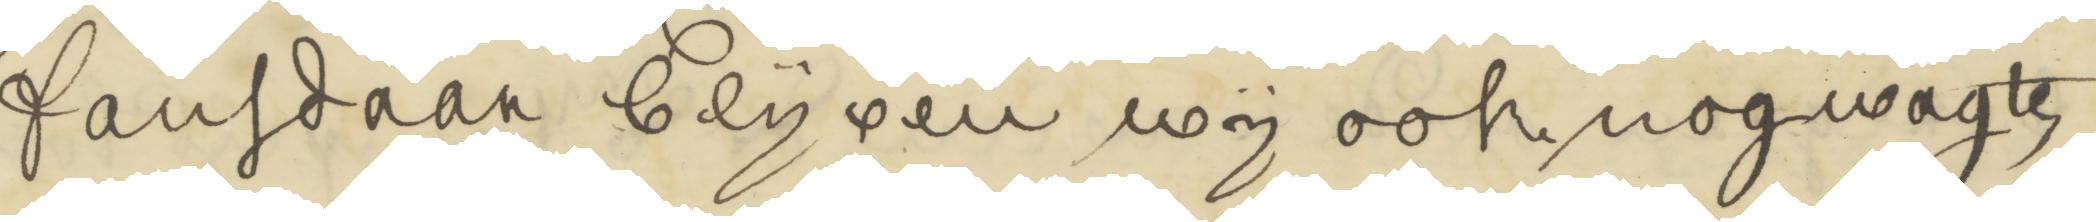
fausdaar blijven wij ook nog wagten
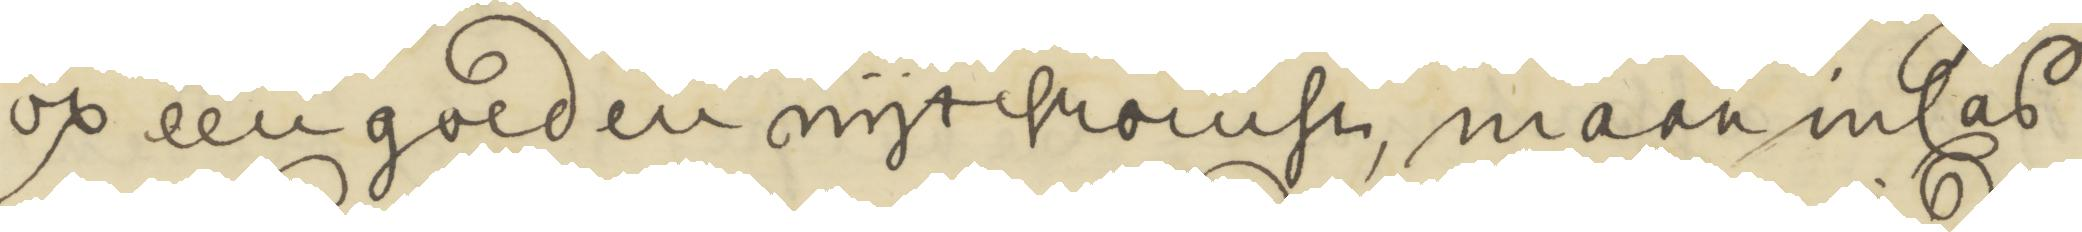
op een goeden uijtkomst, maar in Cas
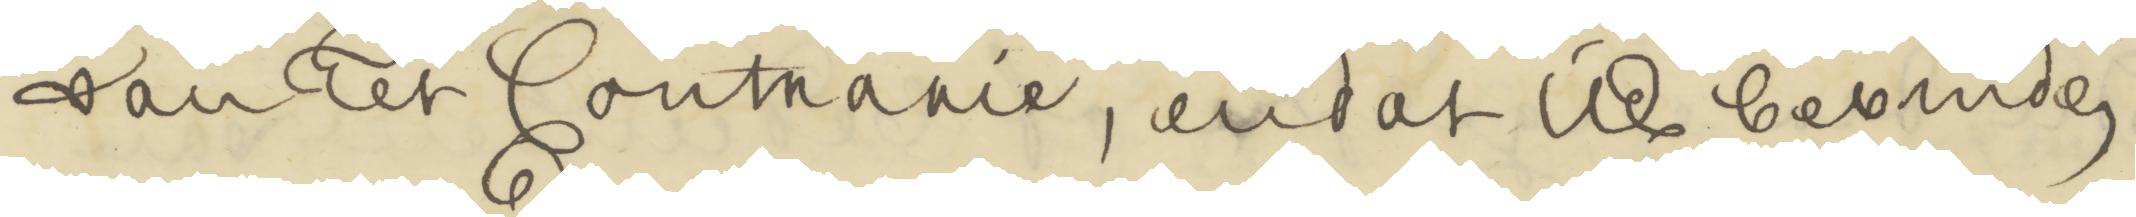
van het Contrarie, en dat UE bevinden
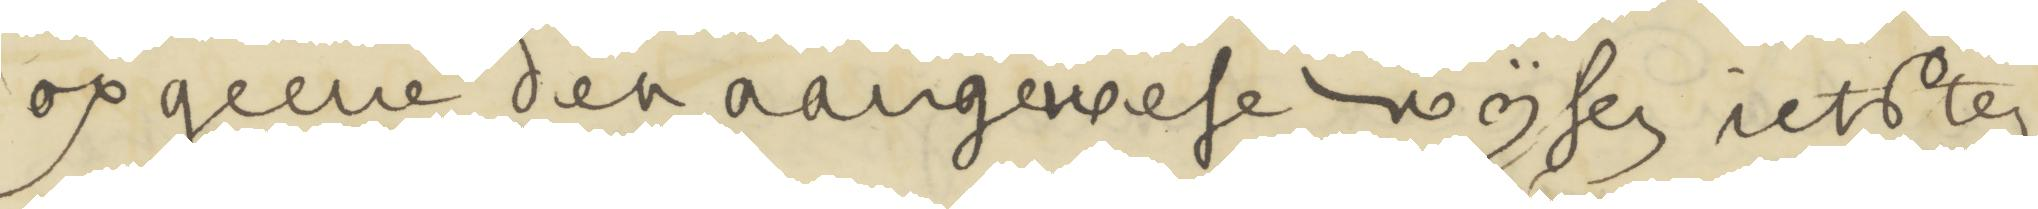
op geene der aangewese wijsen iets ten
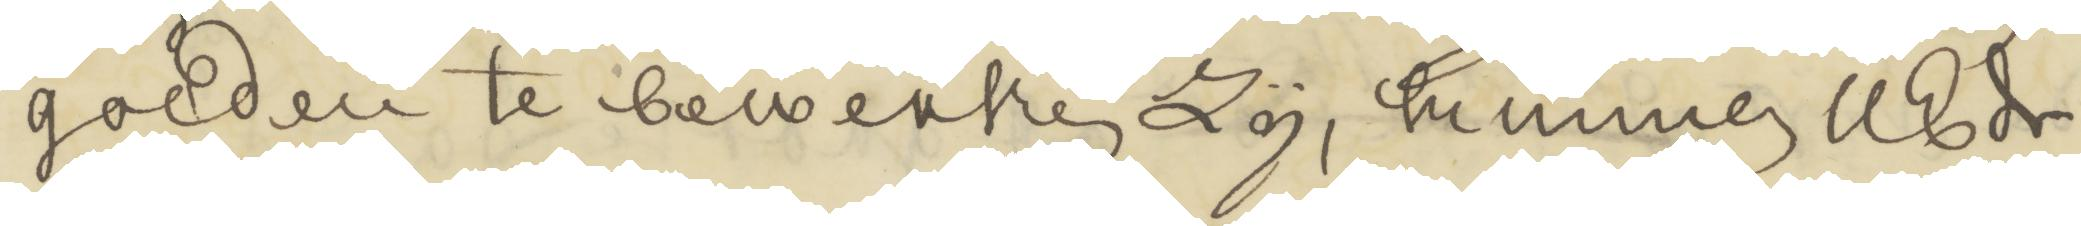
goeden te bewerken zij, kunnen UE de
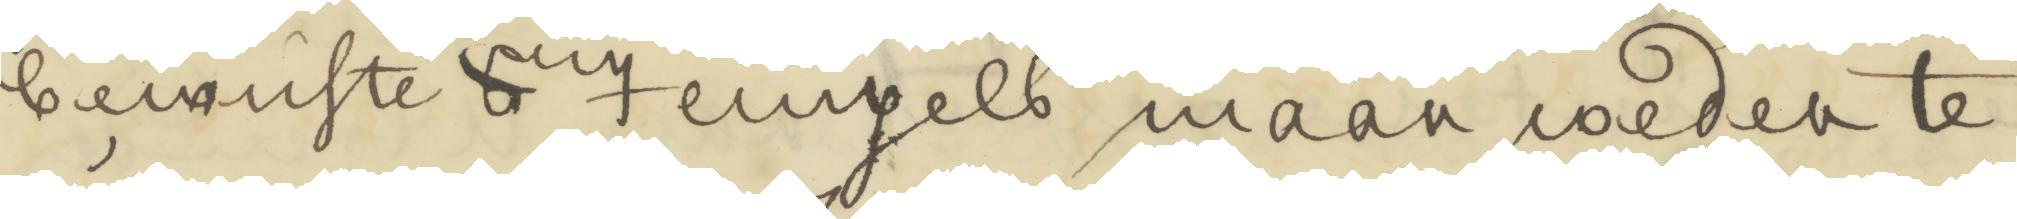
bewuste Stempels maar weder te
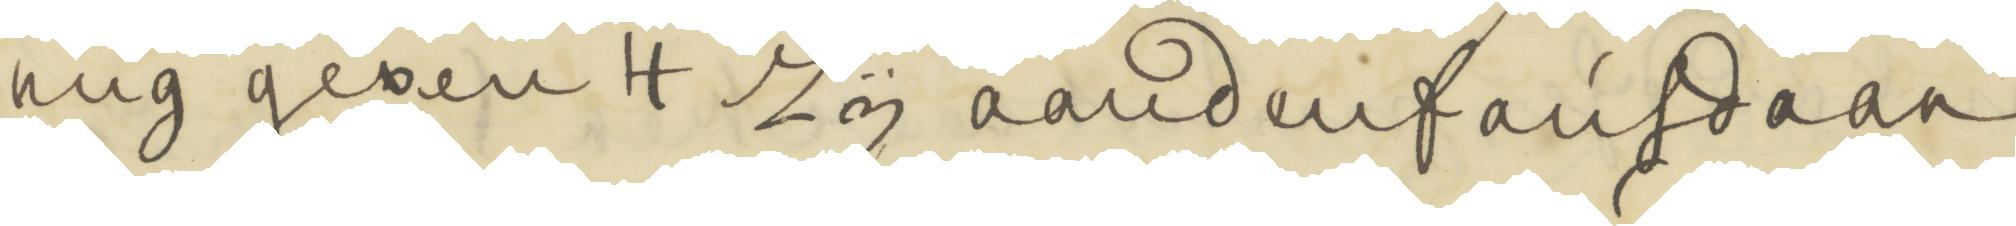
rug geven 't zij aanden fausdaar
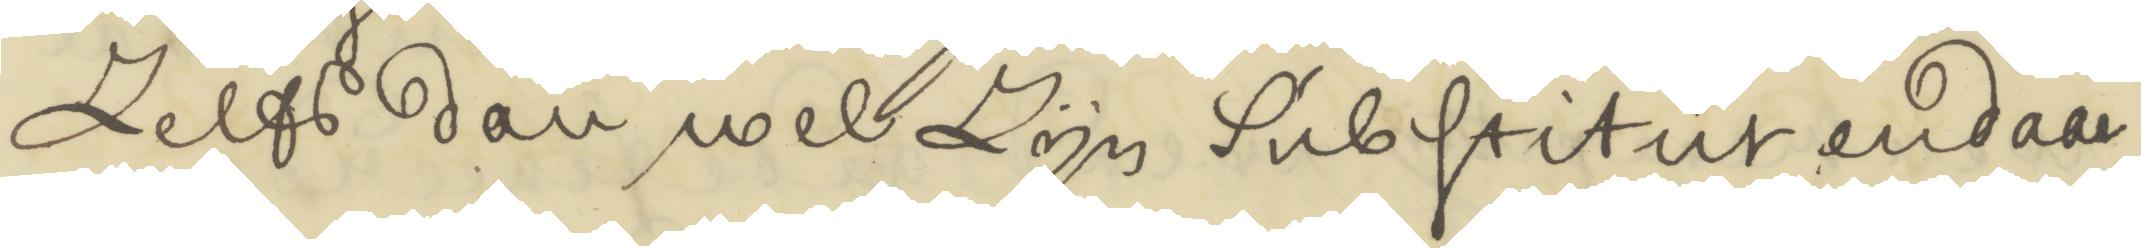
zelfs dan wel zijn substitut en daar
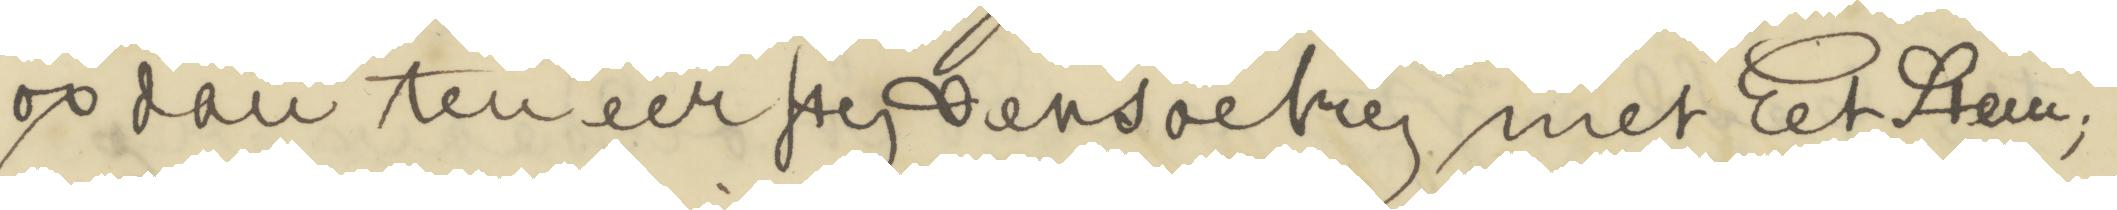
op dan ten eersten versoeken met het stem„
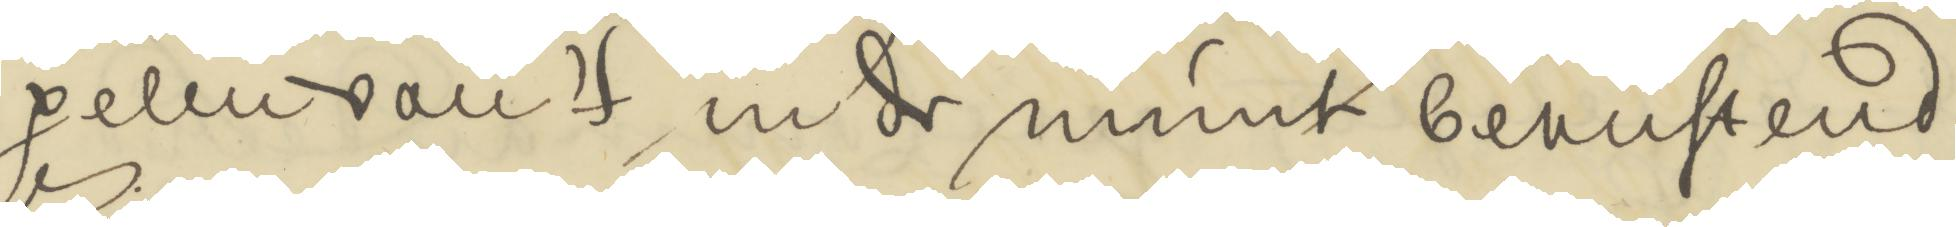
pelen van ’t in de munt berustend
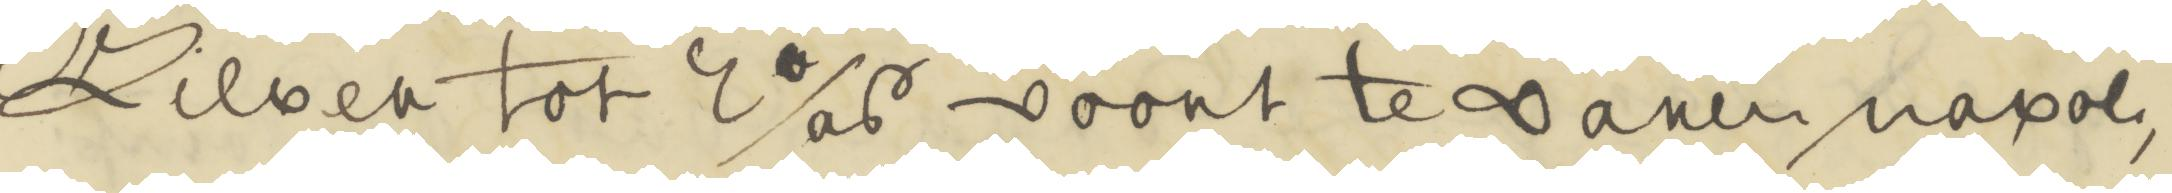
Zilver tot r/aso voort te varen navol,
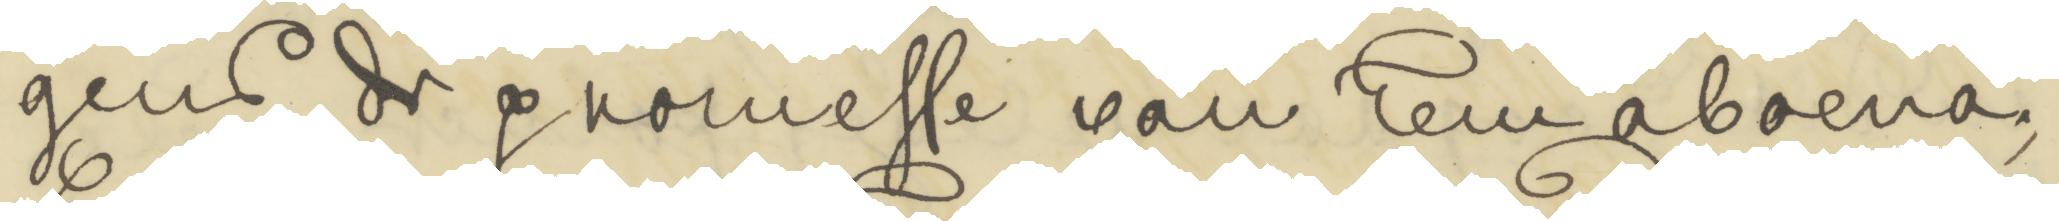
gens de promesse van hem aboena„
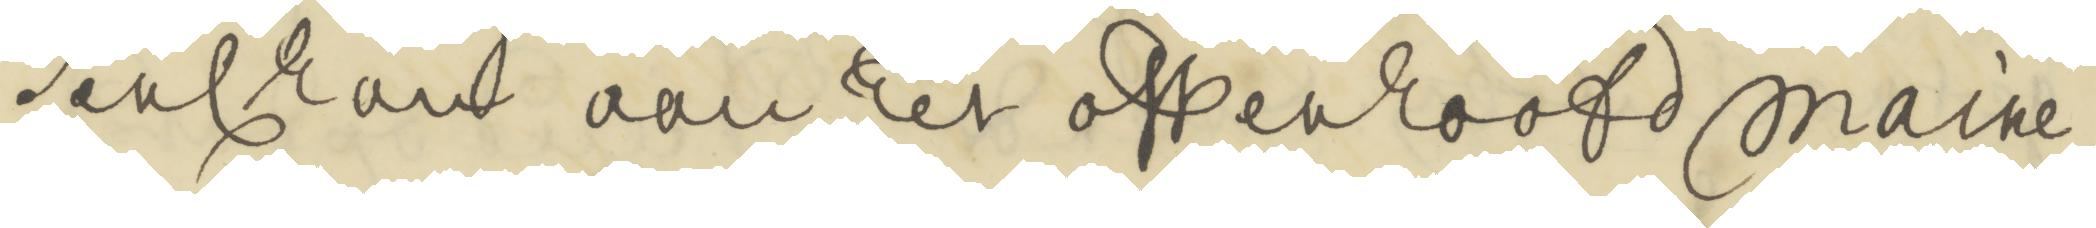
serchan aan het opperhoofd maire
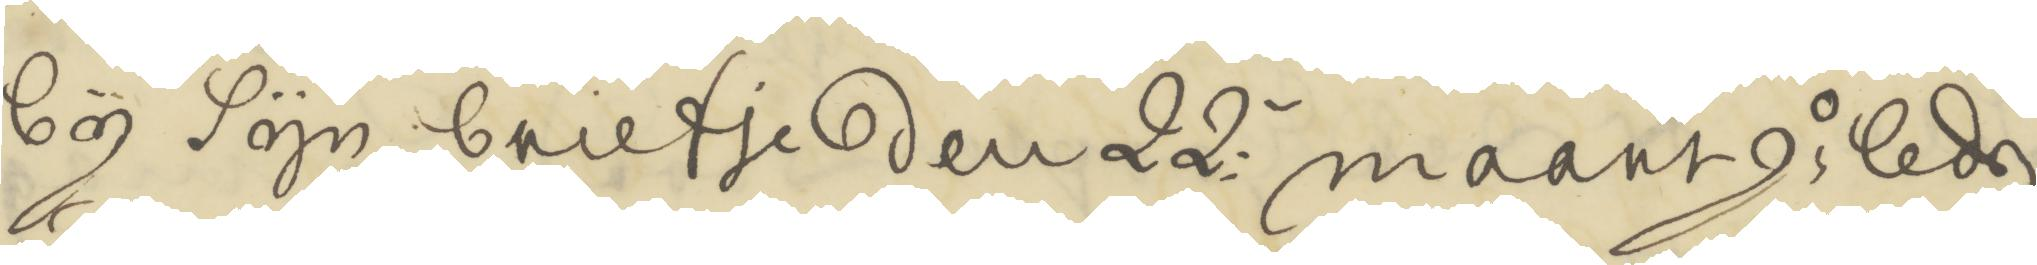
bij sijn briefje den 22:' maart j„o leden
